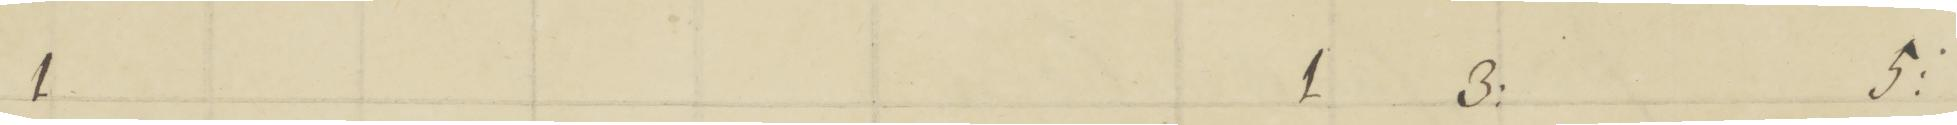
1 1 3: 5:
